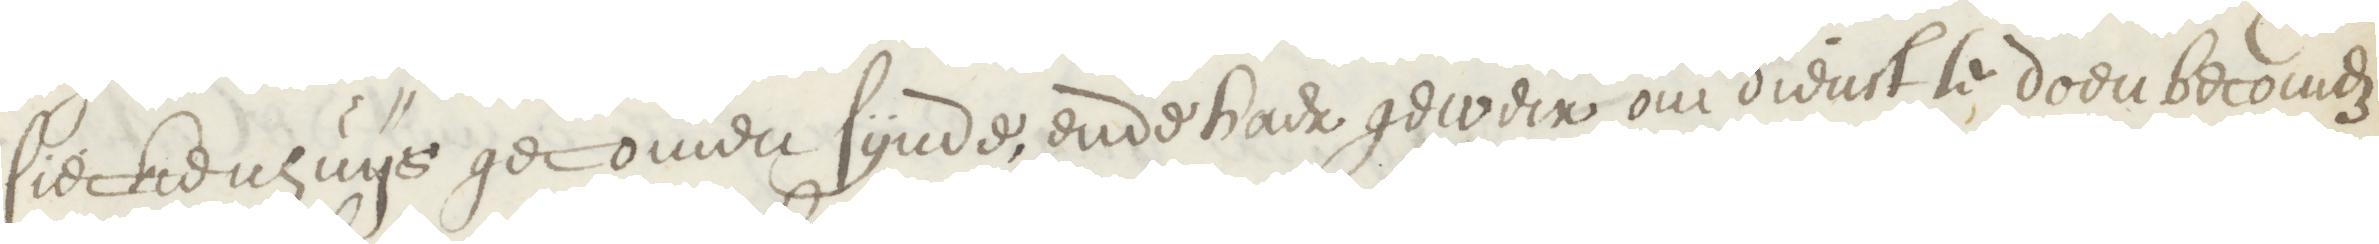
sieckenhuijs gecomen sijnde, ende haer geweir om dienst te doen becomen
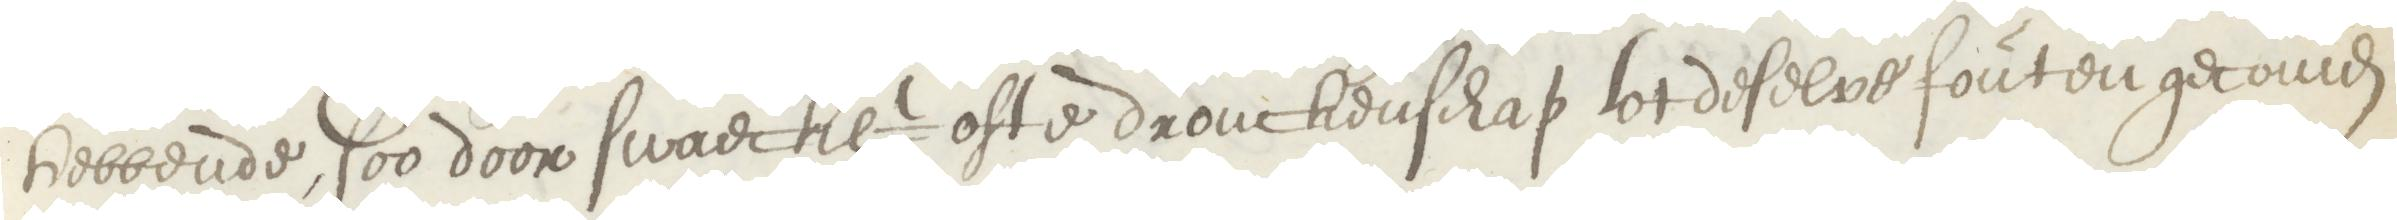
hebbende, soo door swaeckh=t ofte dronckenschap tot deselve fouten gecomen
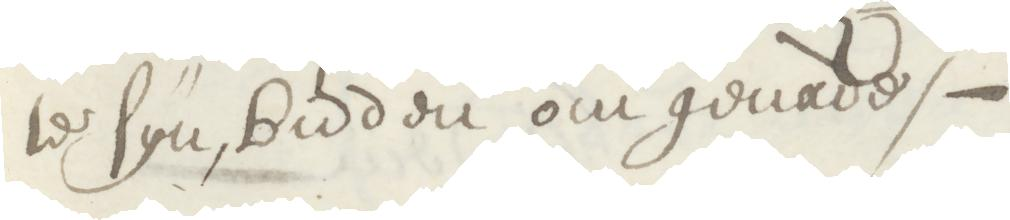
te sijn, bidden om genade/ —
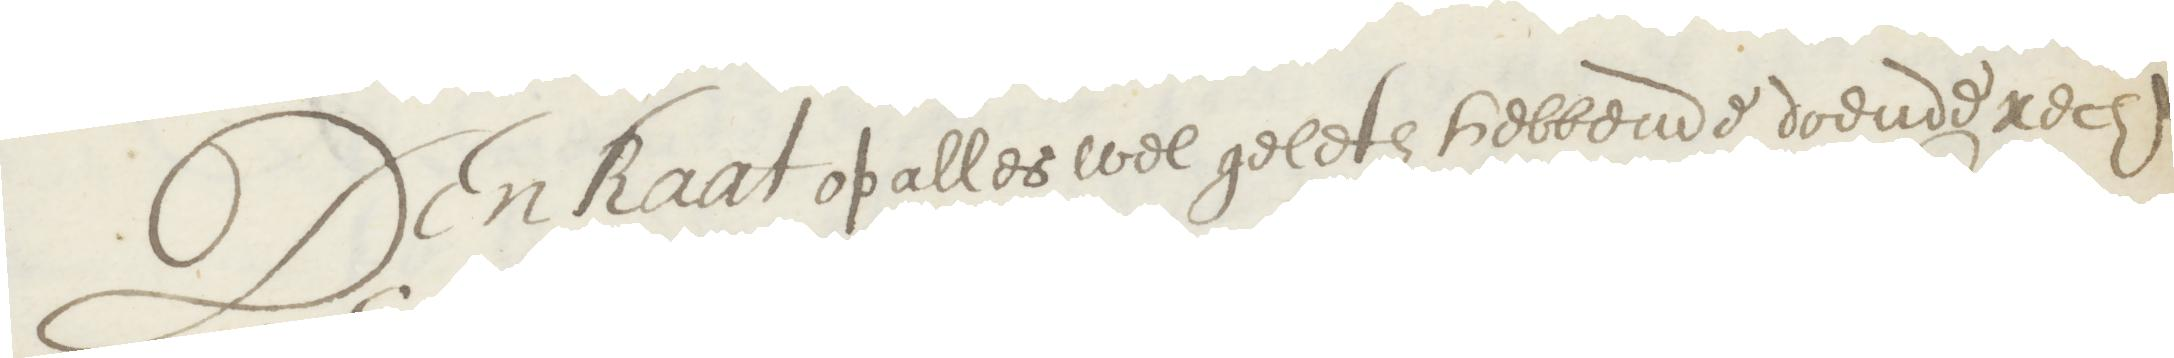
Den Raat op alles wel geleten hebbende doende recht
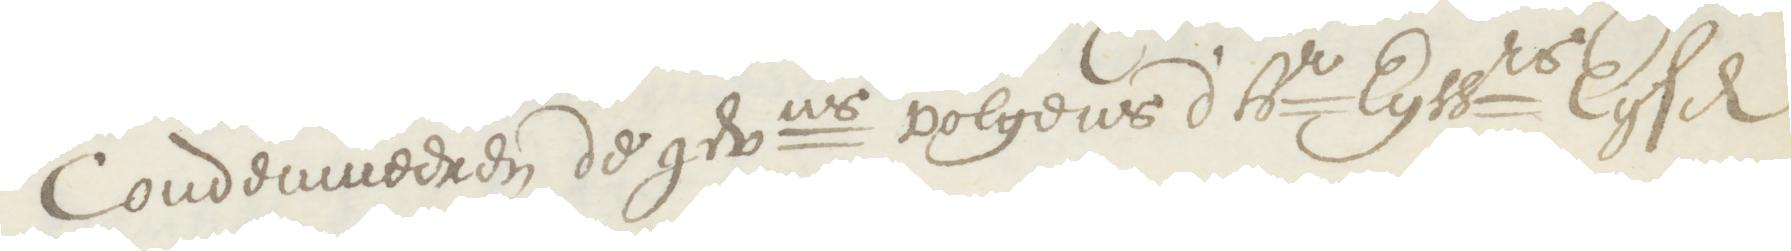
Condemneeren de gev=ns volgens d’ H=r Eyss=rs Eysch
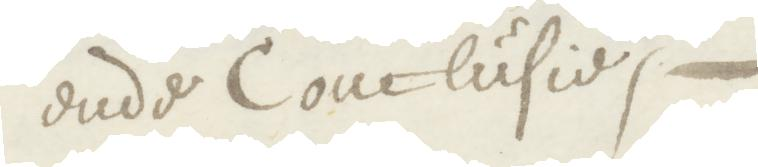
ende Conclusie, —
